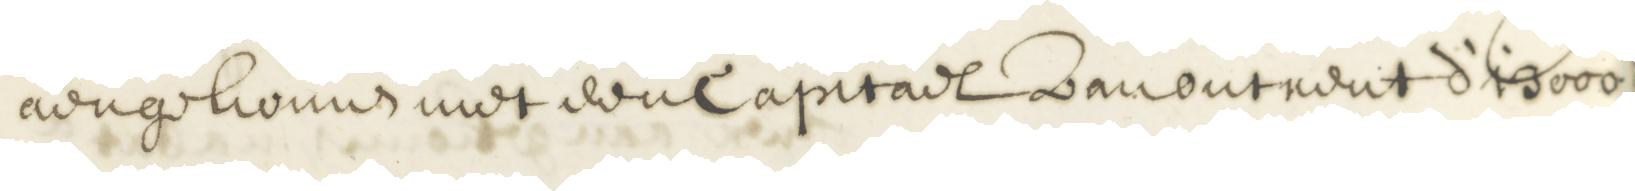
aengekomen met een capitael van ontrent d’ 13000
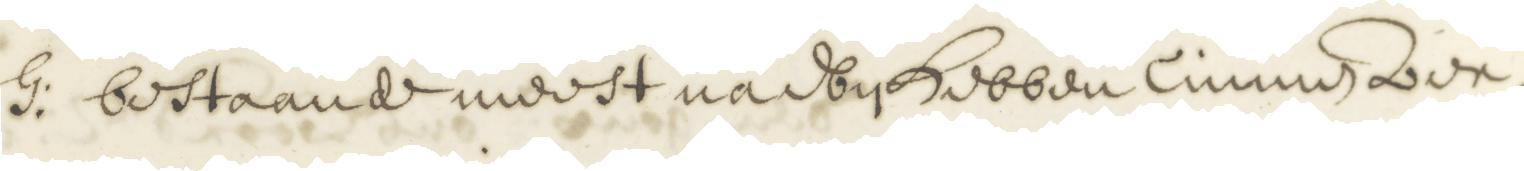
G: bestaande meest na wij hebben cunnen ver„
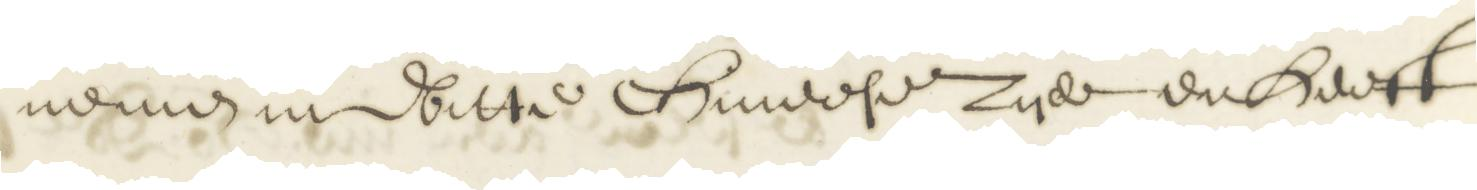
nemen in Witte chineese zijde en heeft
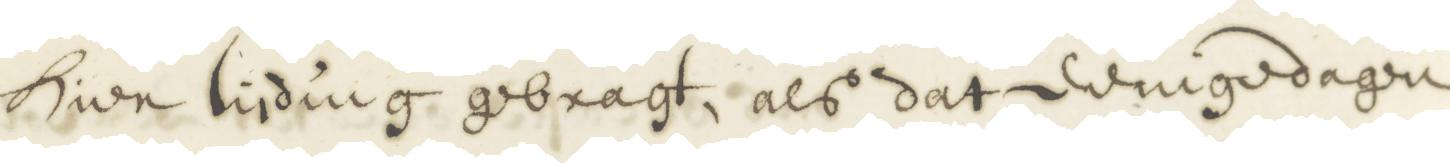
hier tijding gebragt, als dat eenige dagen
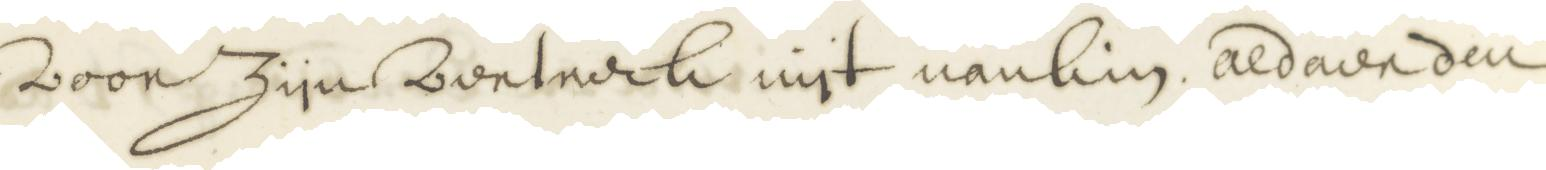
voor zijn vertreck nijt nankin aldaer den
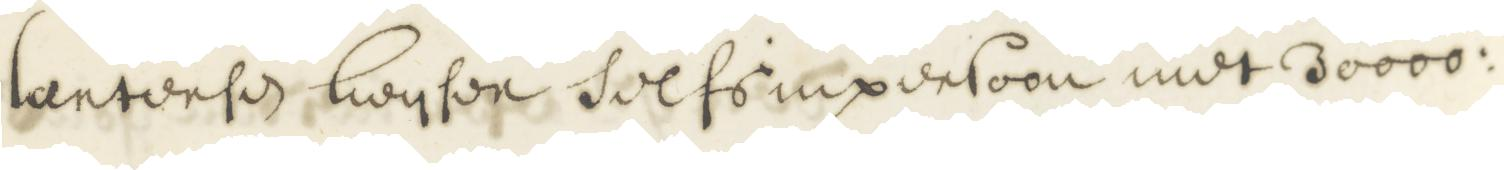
tartersen keijser selfs in persoon met 30000:
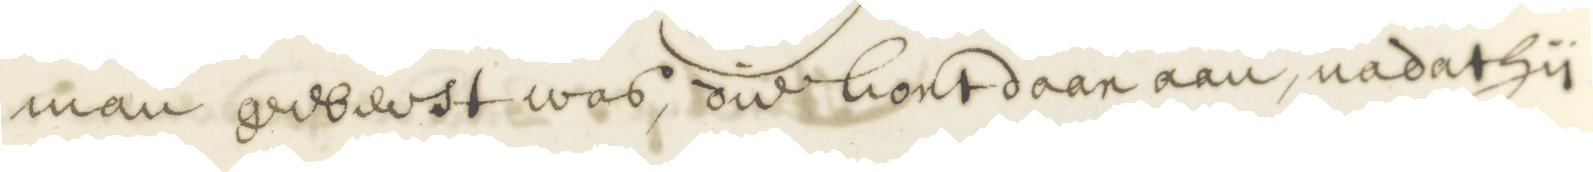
man geweest was, die kort daar aan, nadat hij
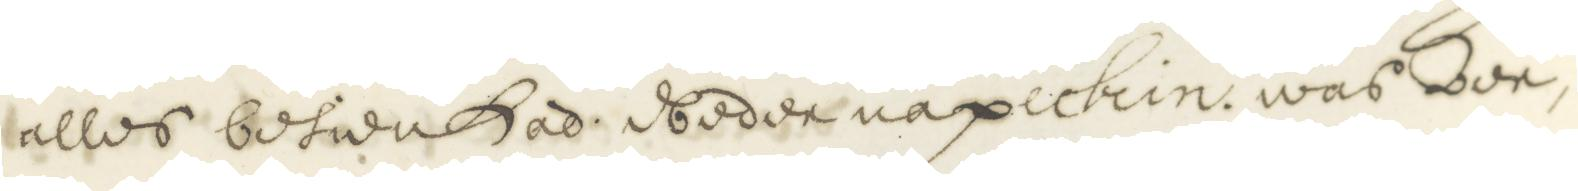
alles besien had weder na peckin was ver,
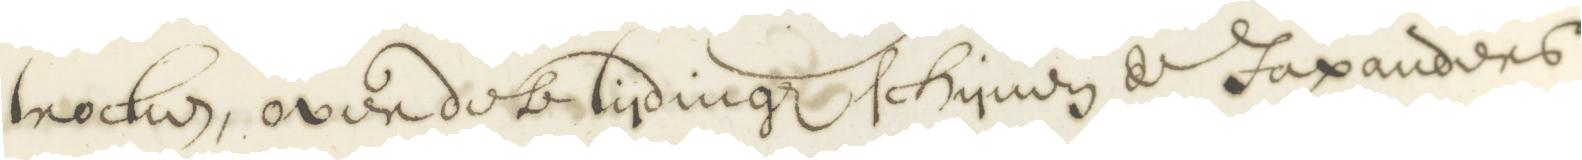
trocken, over dele tijdingh schijnen de Japanders
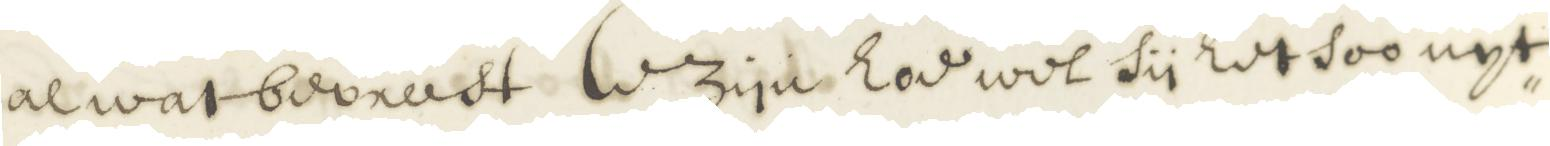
al wat bevreest te zijn hoe wel sij het soo uijt„
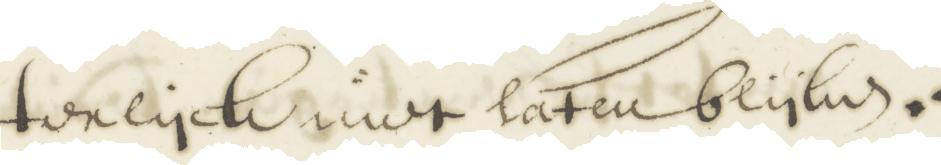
terlijck niet laten blijken.
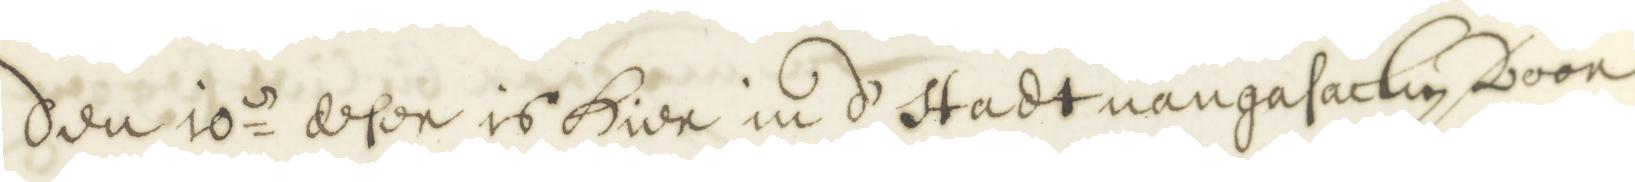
den 10:en deser is hier in d’ stadt nangasackij voor
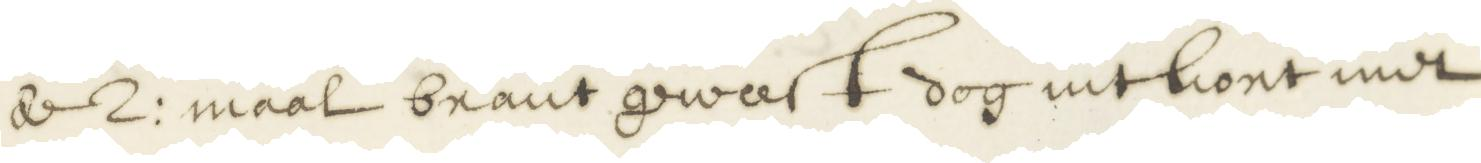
de 2: maal brant geweest dog in't kort met
